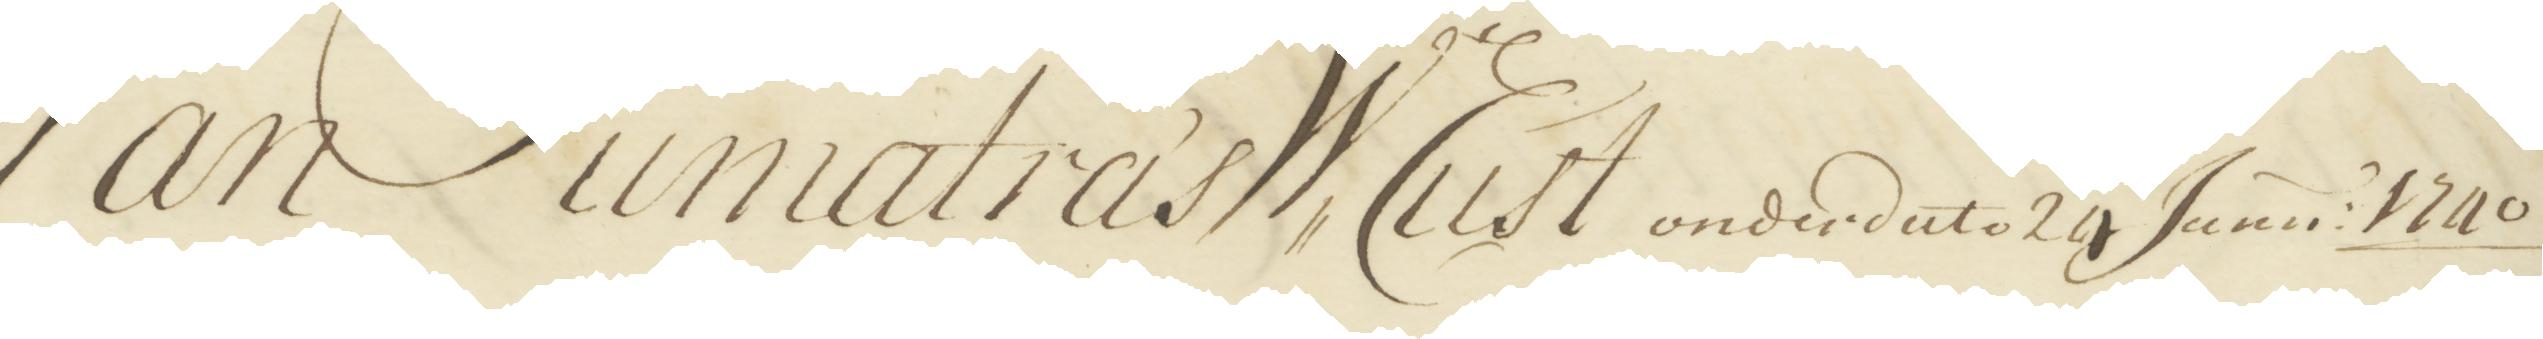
Van Sumatra's W„t Cust onder dato 24 Jann: 1740
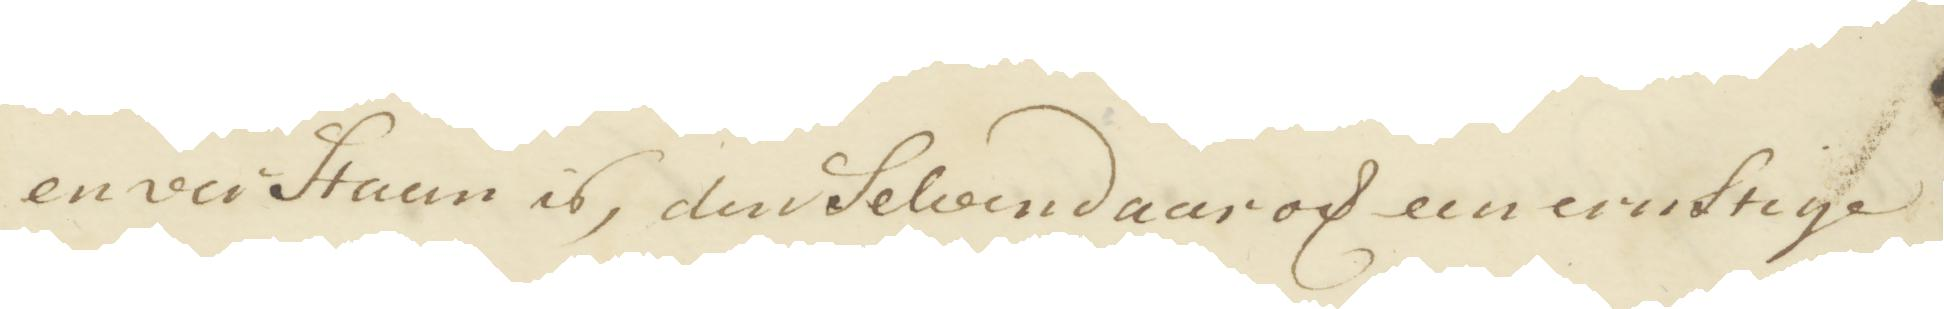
en verstaan is, den selven daar over een ernstige
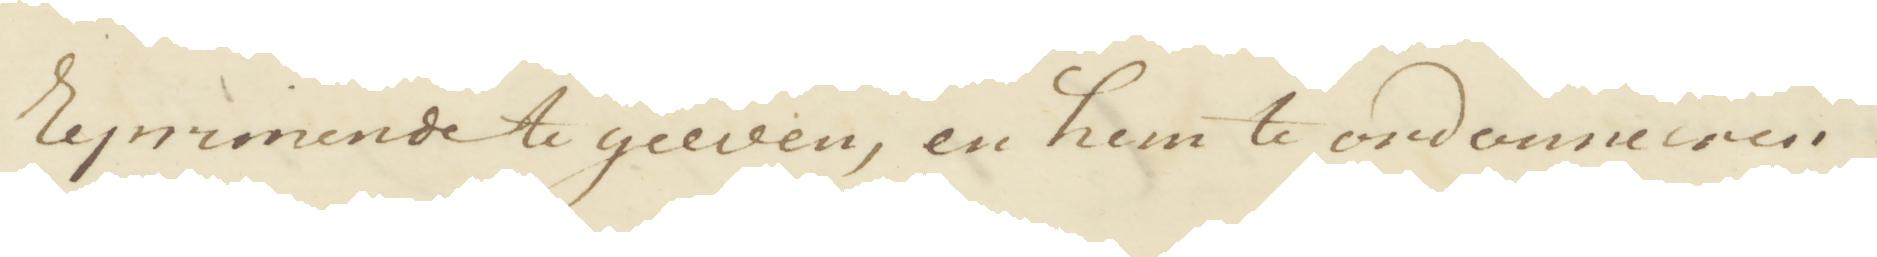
reprimende te geeven, en hem te ordonneeren
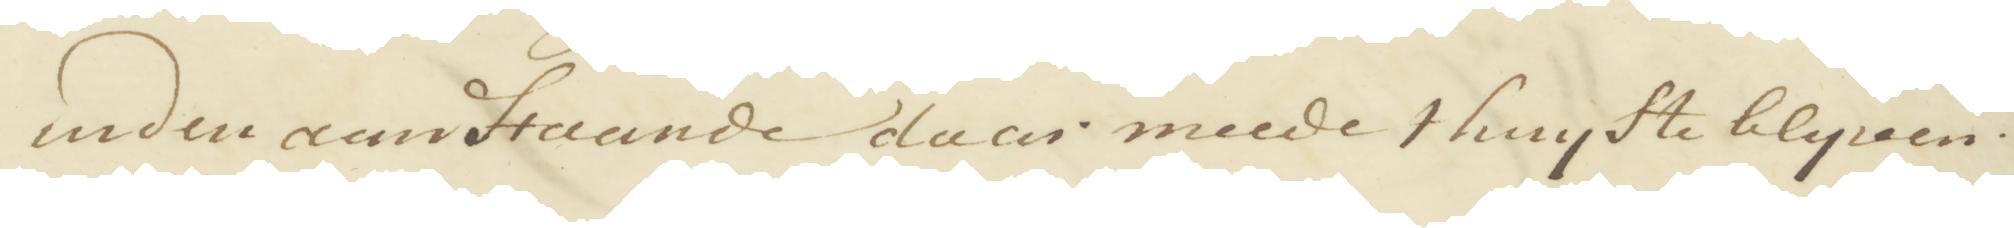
in den aanstaande daar meede thuys te blyven.
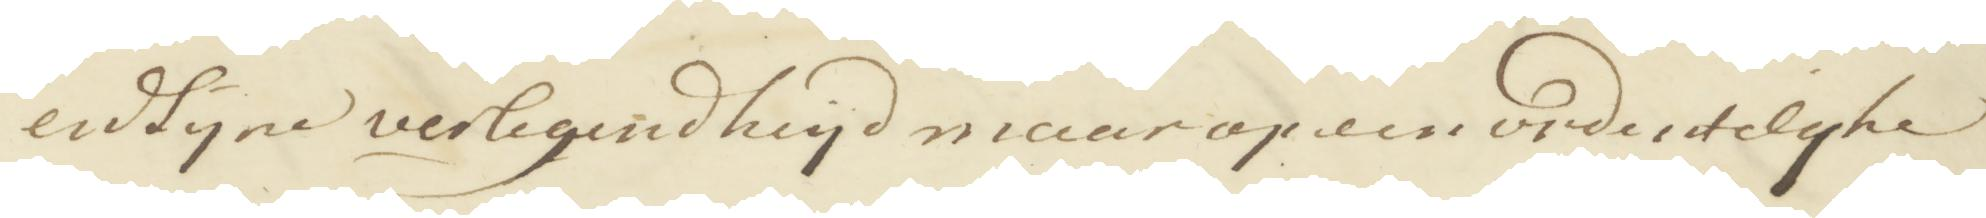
en sijne verlegendheijd maar op een ordentelyke
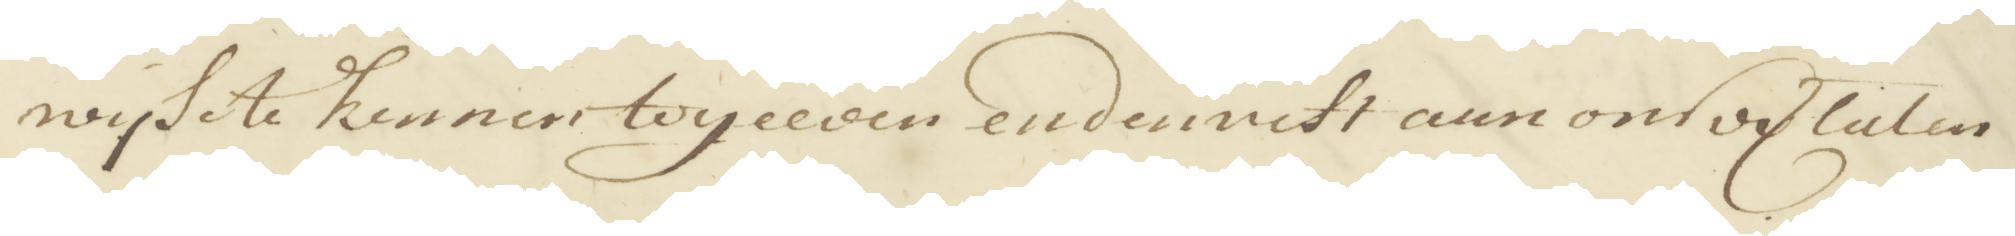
wijse te kennen te geeven en den rest aan ons overlaten
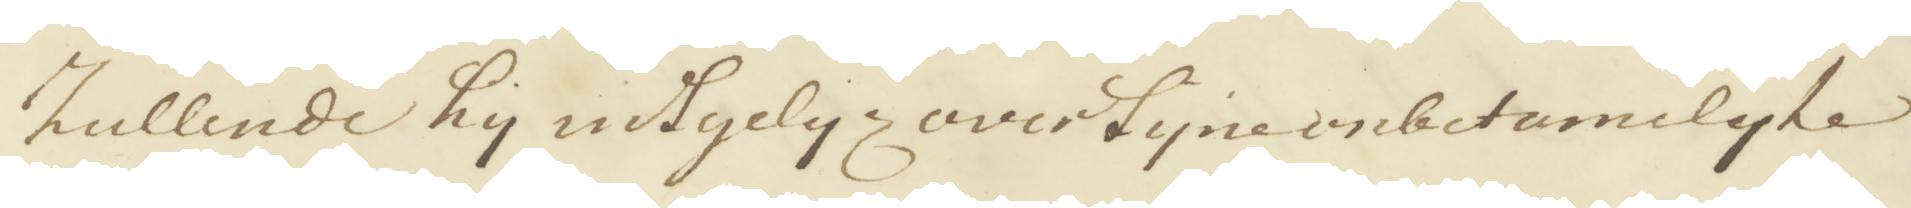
zullende hij uitgelijx over sijne onbetamelijke
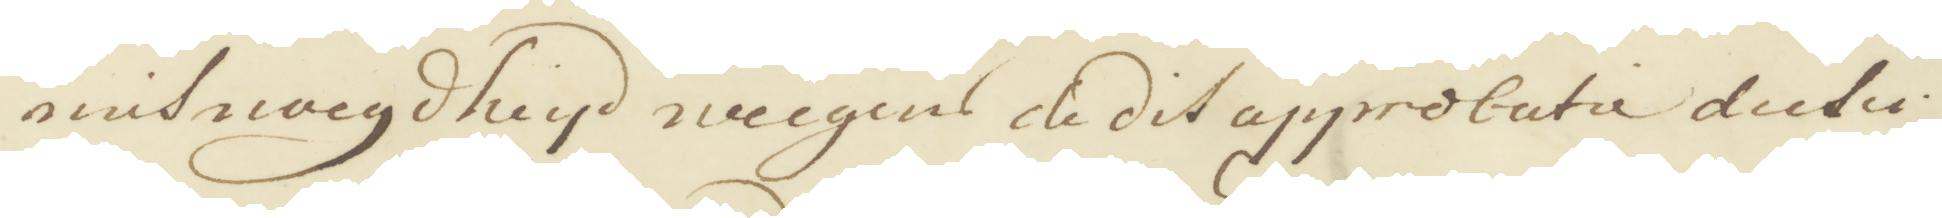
misnoegdheijd weegens de dit approbatie deeser
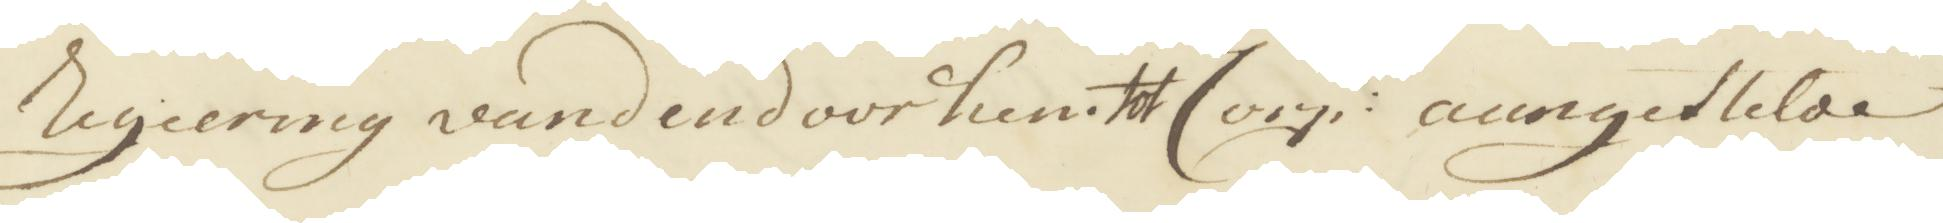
regeering van den door hem tot Corp:s aangestelde
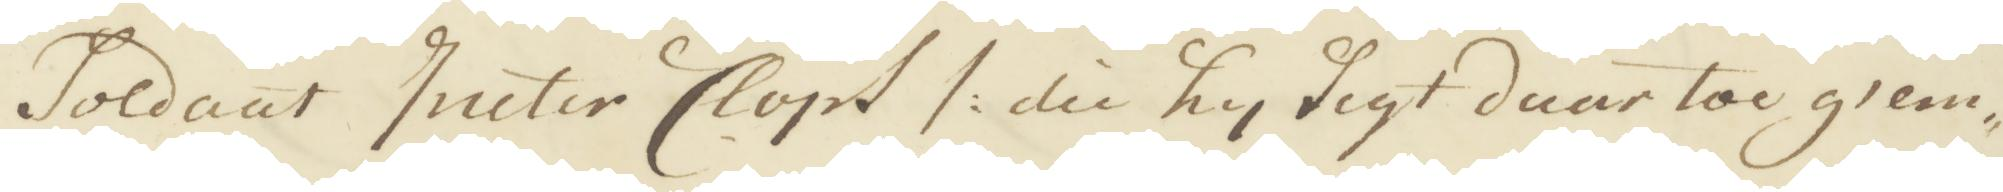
soldaat Pieter Clops /: die hy segt daar toe g'em„
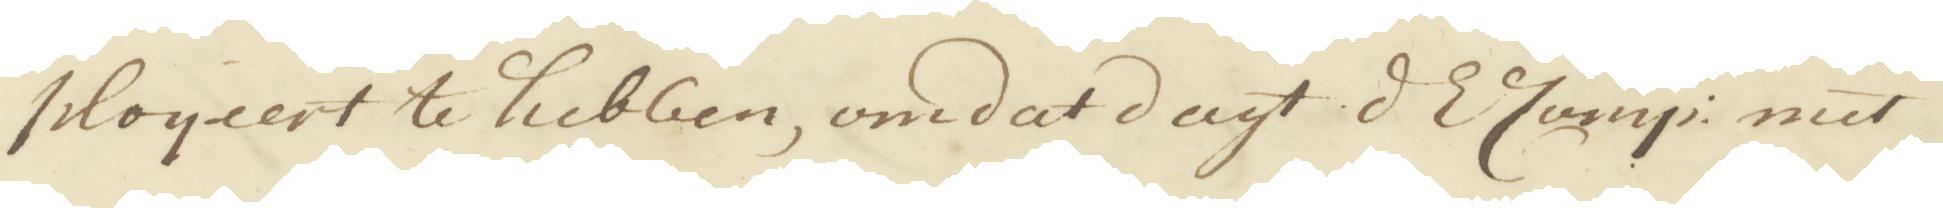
ployeert te hebben, omdat d agt dE Comp:s met
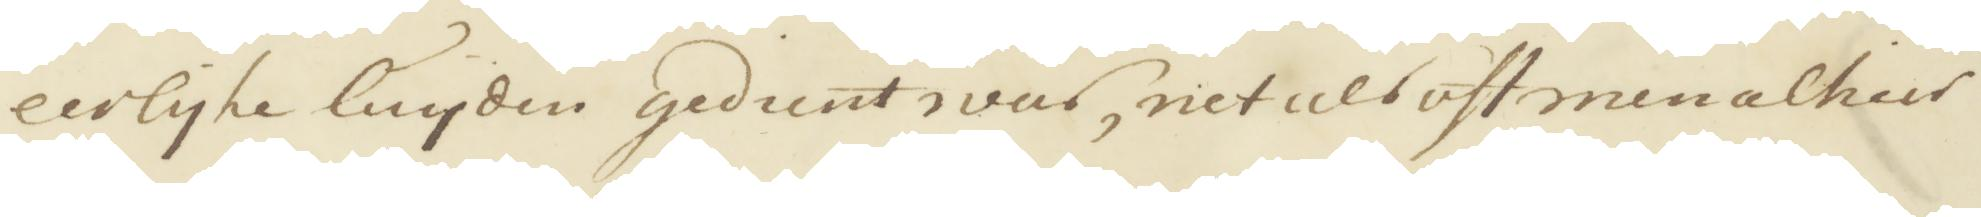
eerlijke luijden gedient was, net als off men alhier
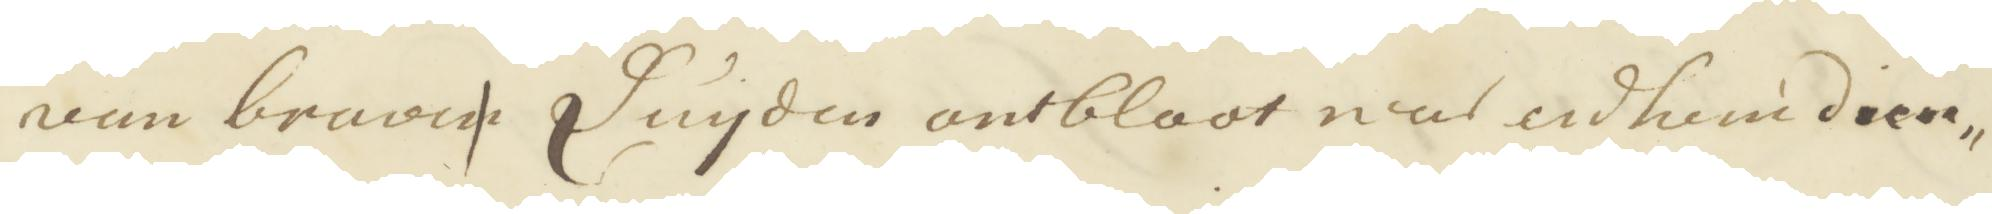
van braven Luijden ontbloot was en hem dien„
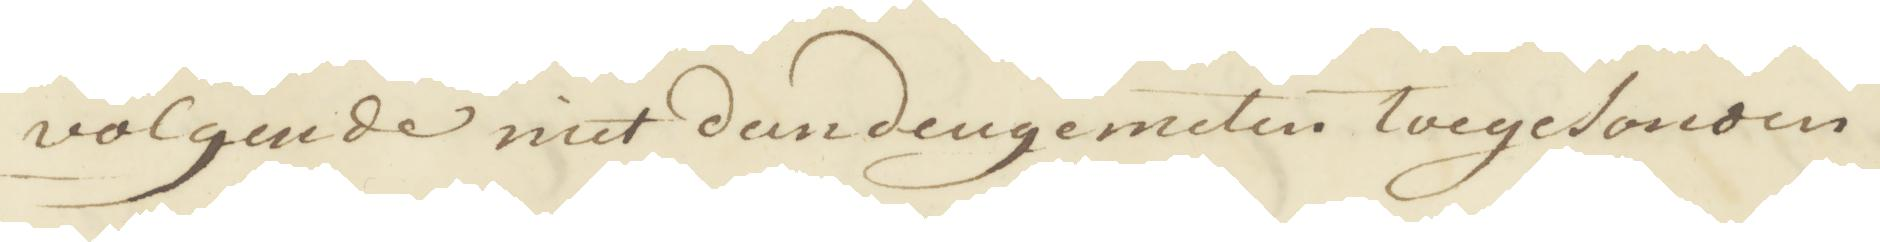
volgende niet dan den gemeten toegesonden
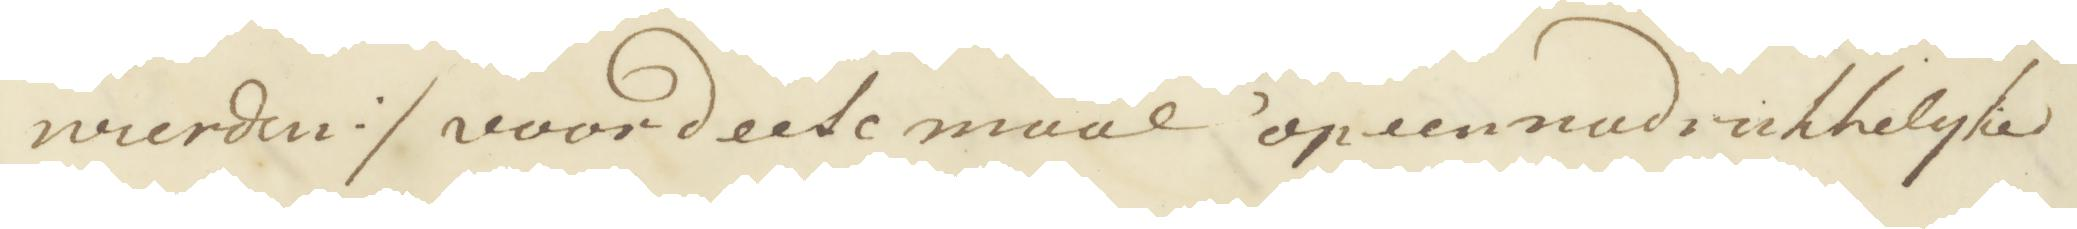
wierden :/ voor deese maal op een nadrukkelyke
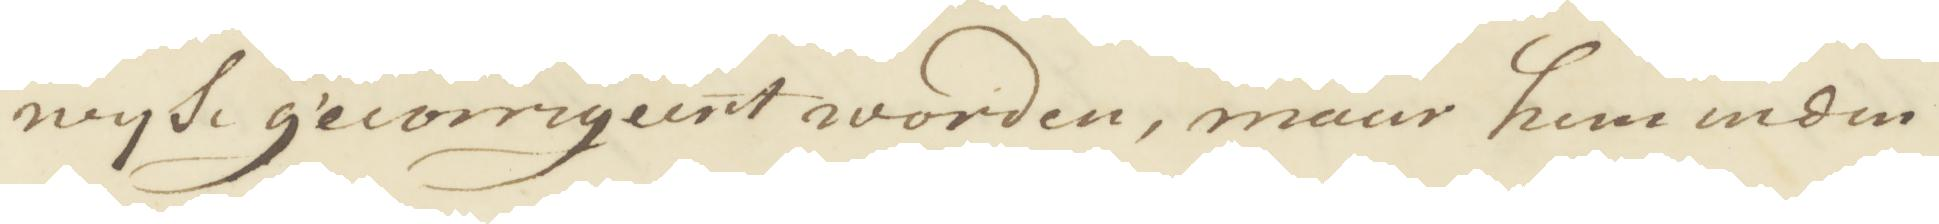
wyse g'ecorrigeert worden, maar hem in den
